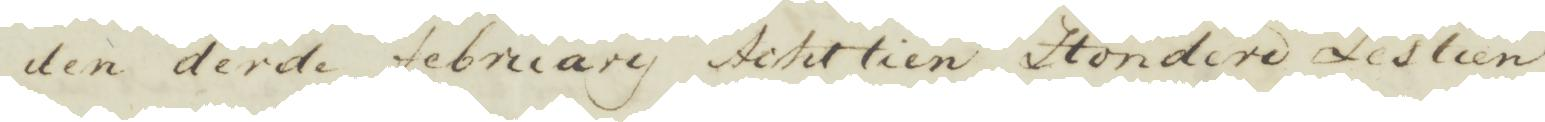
den derde februarij Achttien Honderd Zestien
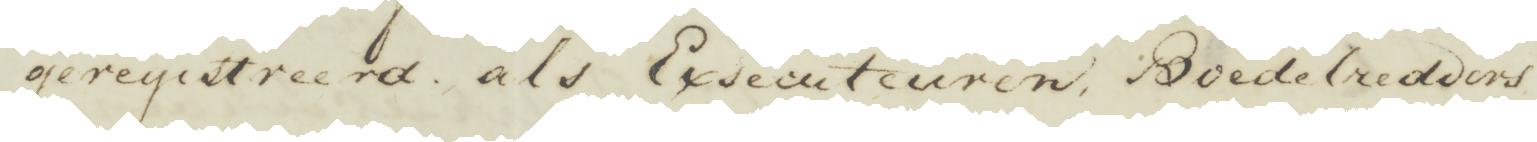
geregistreerd., als Exsecuteuren, Boedelredders
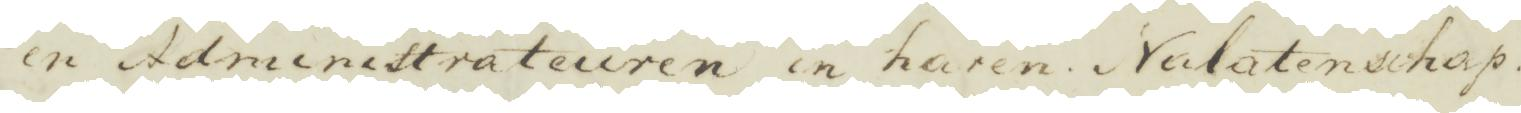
en Administrateuren in haren. Nalatenschap
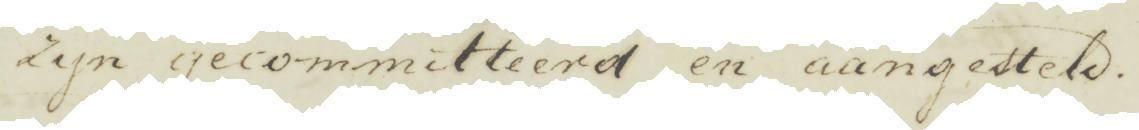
zijn gecommitteerd en aangesteld.
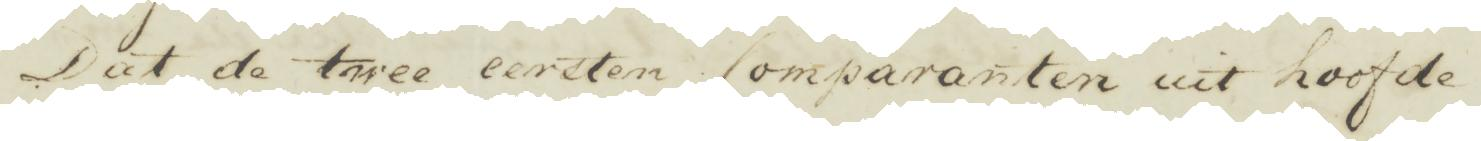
Dat de twee eersten Comparanten uit hoofde
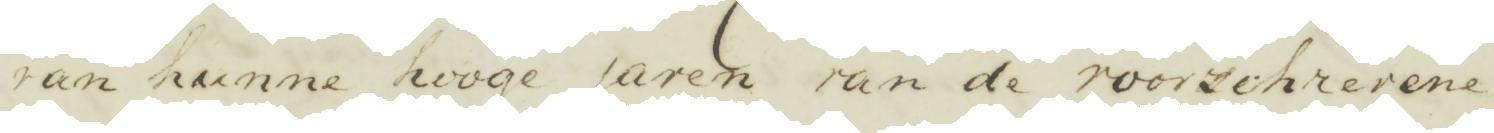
van hunne hooge jaren van de voorschrevene
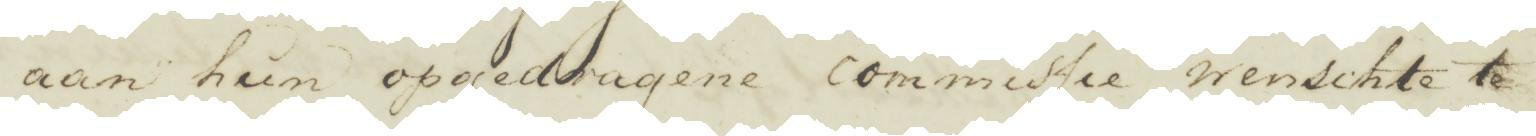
aan hun opgedragene commissie wenschte te
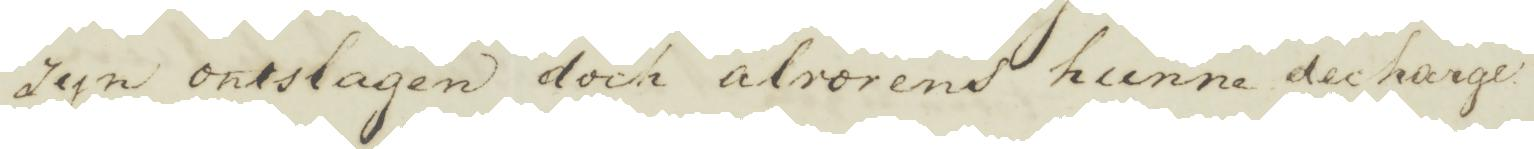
zyn ontslagen doch alvorens hunne decharge
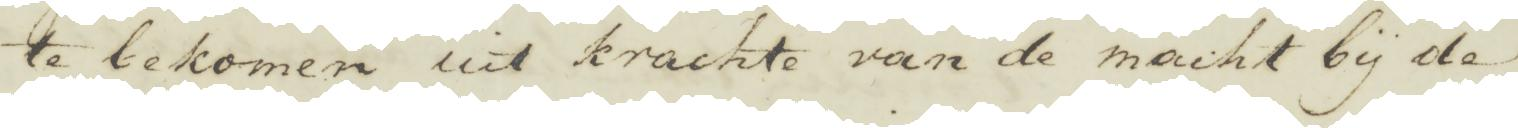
te bekomen uit krachte van de macht bij de
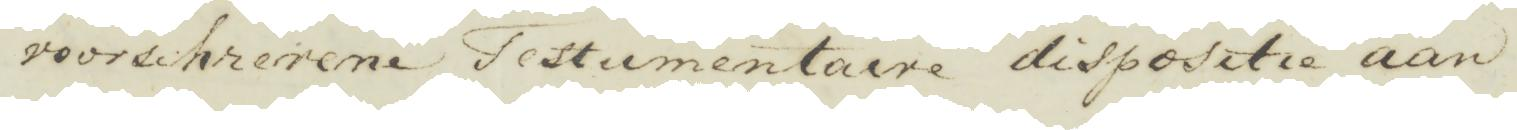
voorschrevene Testumentaire dispositie aan
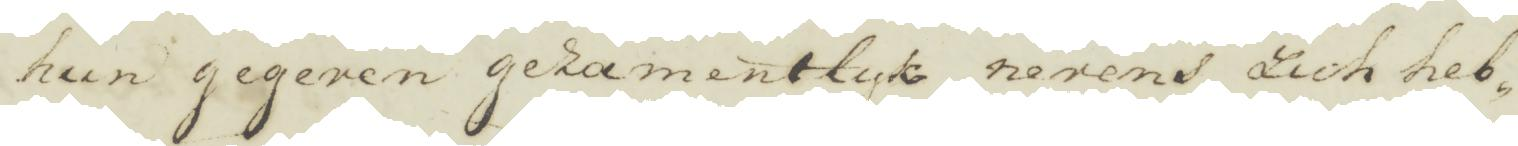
hun gegeven gezamentlyk nevens zich heb„
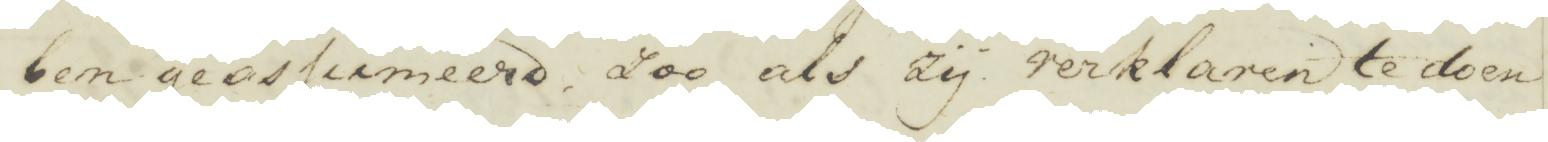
ben geassirmeerd, zoo als zij verklaren te doen
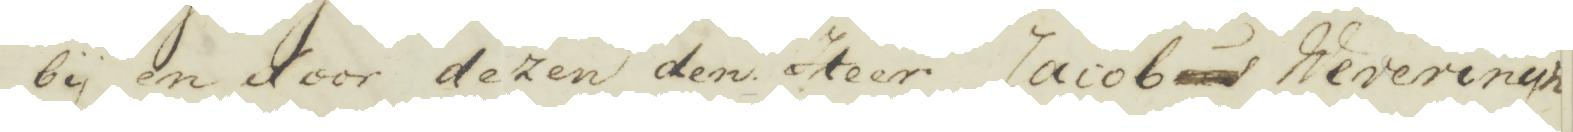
bij en door dezen den Heer Jacobus Weveringh
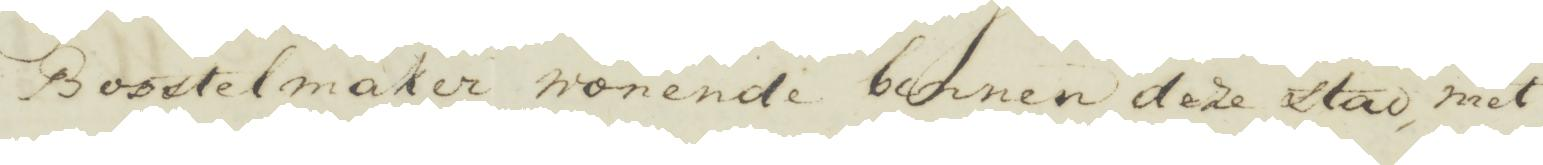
Borstelmaker wonende binnen deze stad, met
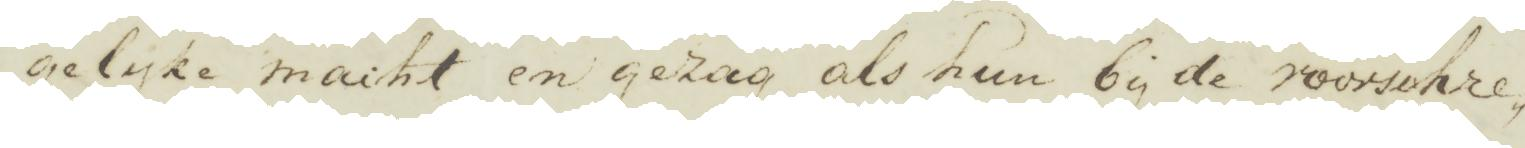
gelijke macht en gezag als hun bij de voorschre
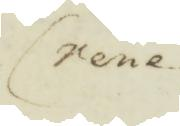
vene
